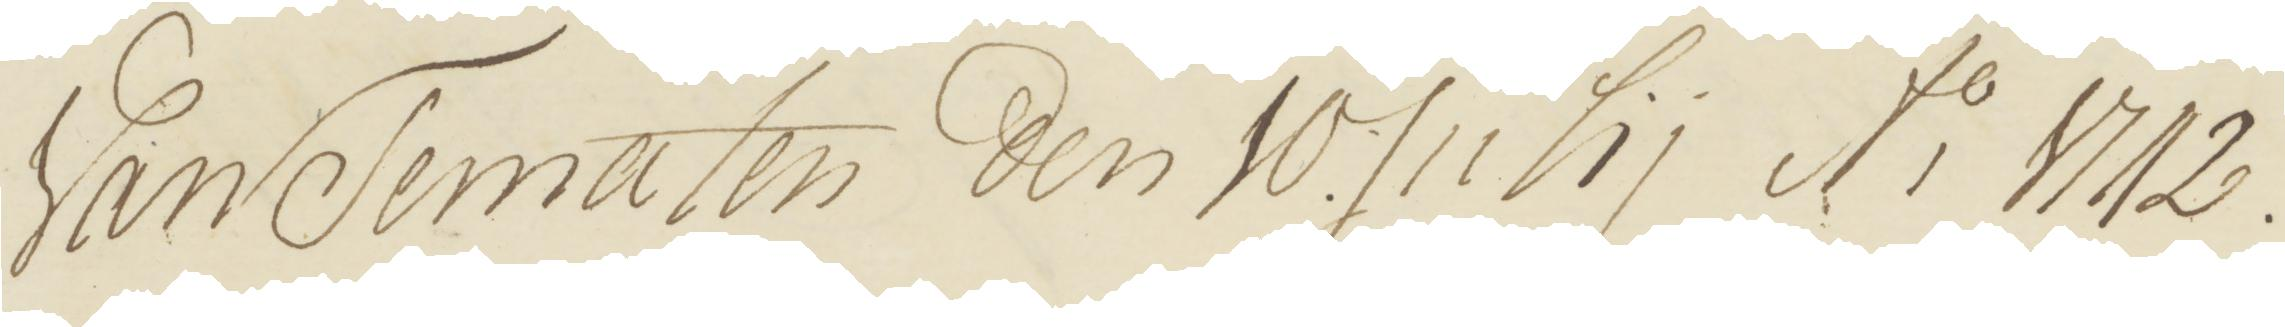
Van Ternaten den 10:Julij A,o 1712.
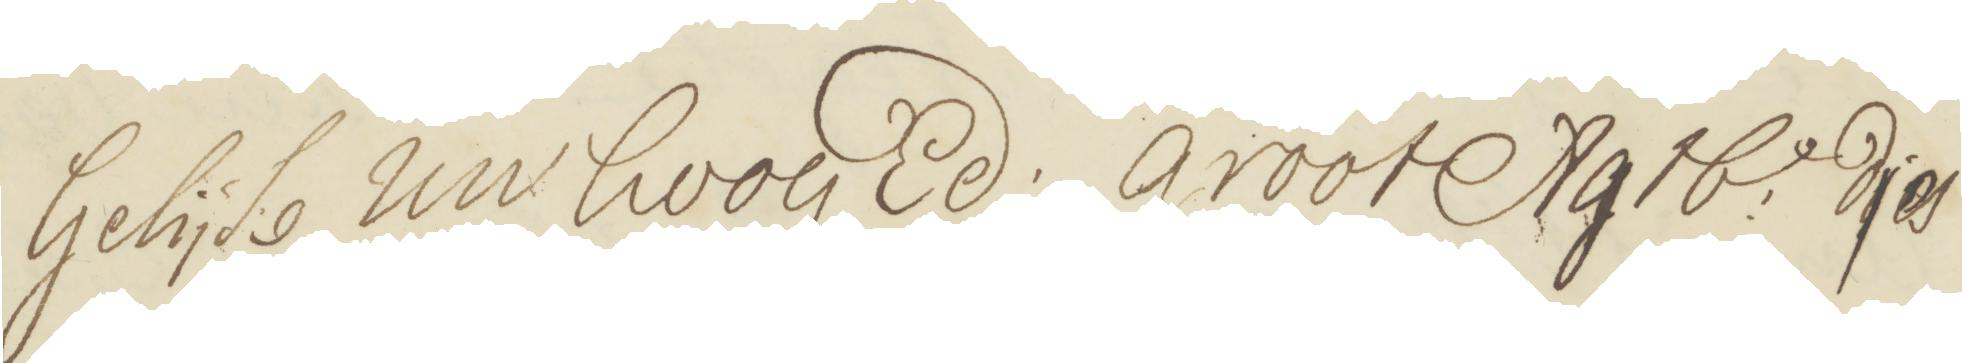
Gelijk uw hoog Ed: groot Agtb:r dies
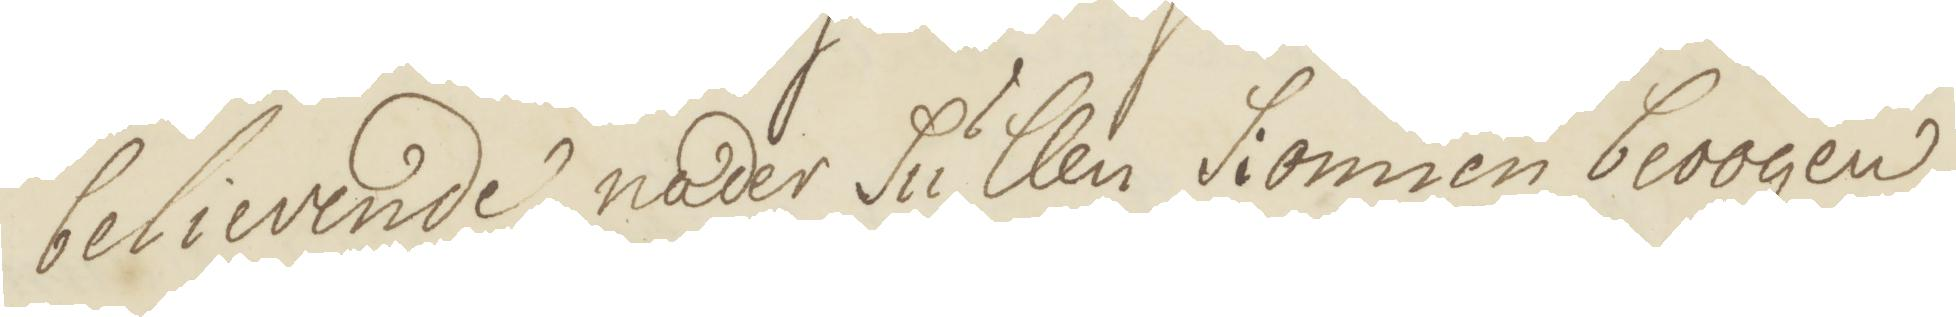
believende, nader sullen konnen beoogen
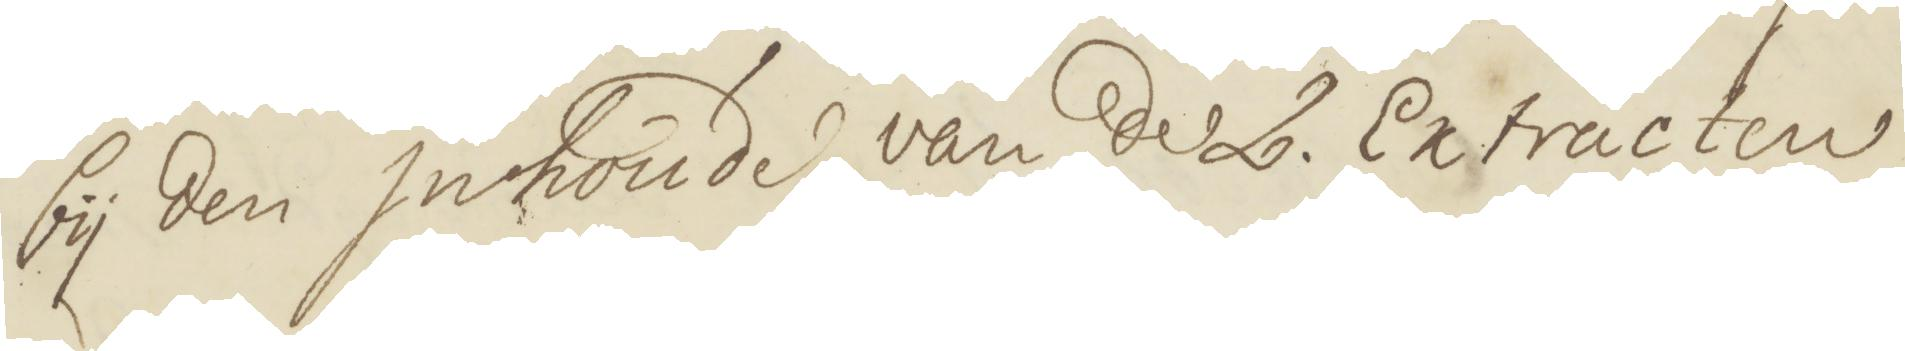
bij den jnhoude van de 2. Extracten
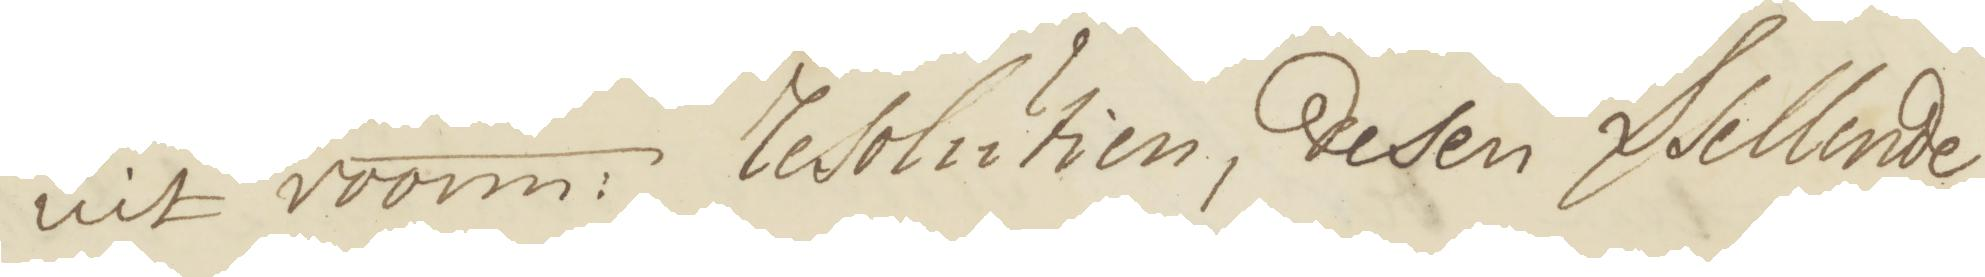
uit voorm: resolutien, desen versellende,
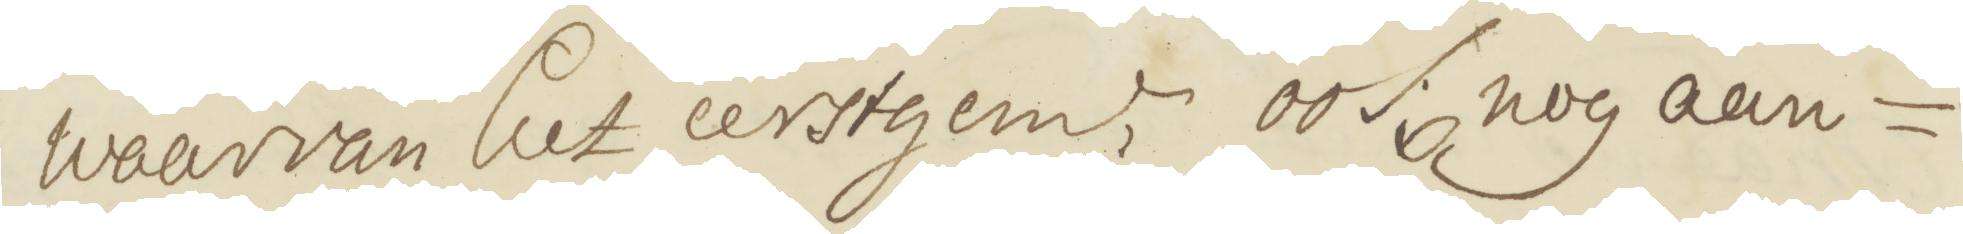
waarvan het eerstgem: ook nog aan=
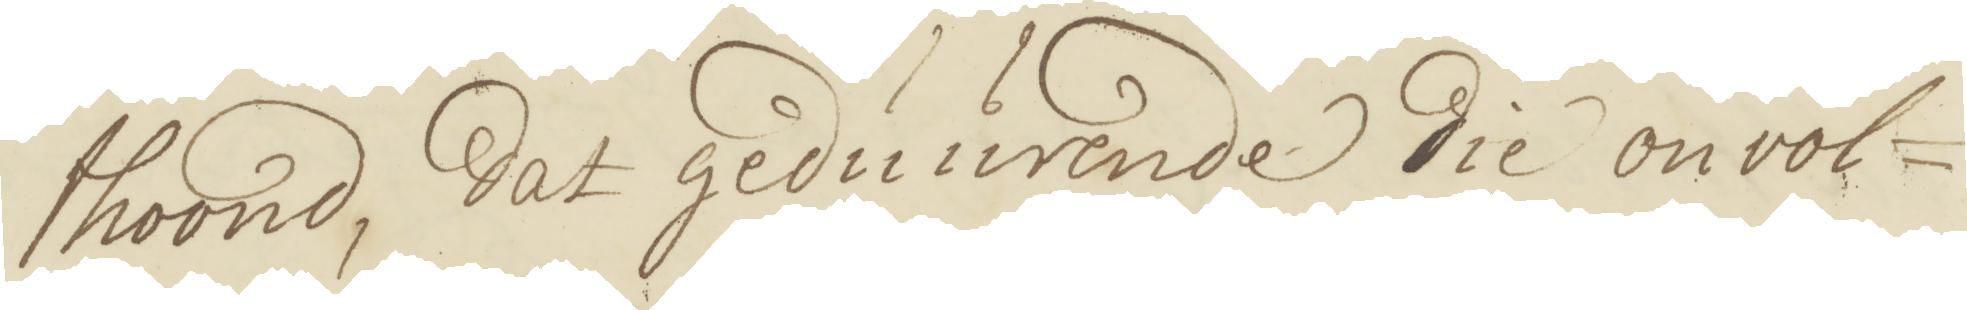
thoond, dat geduurende die onvol=
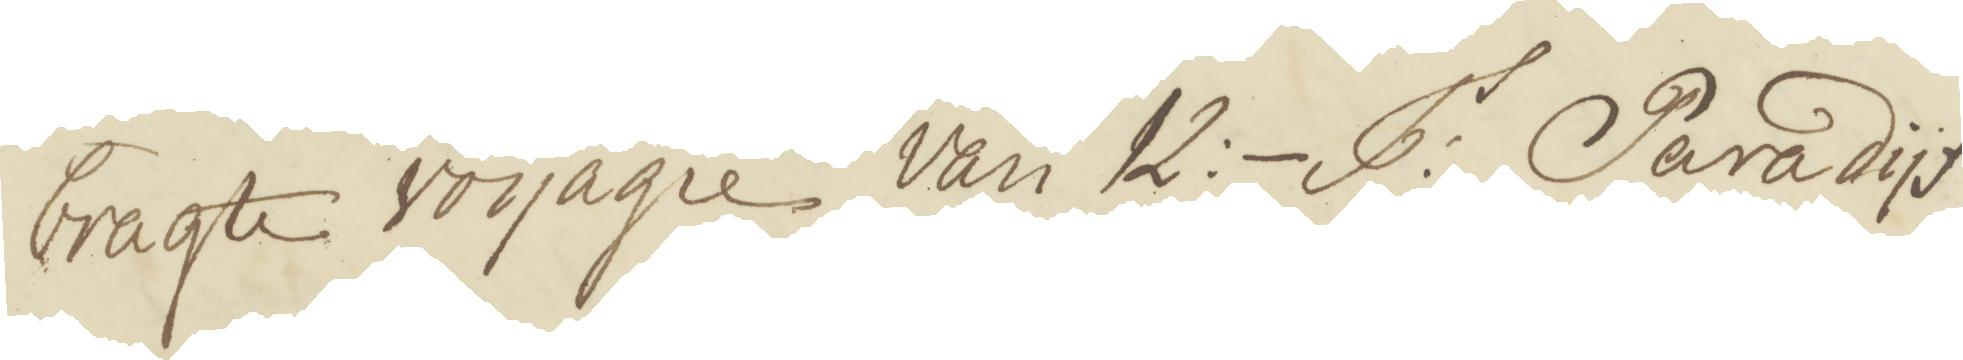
bragte voijagie van 12:– p:s Paradijs
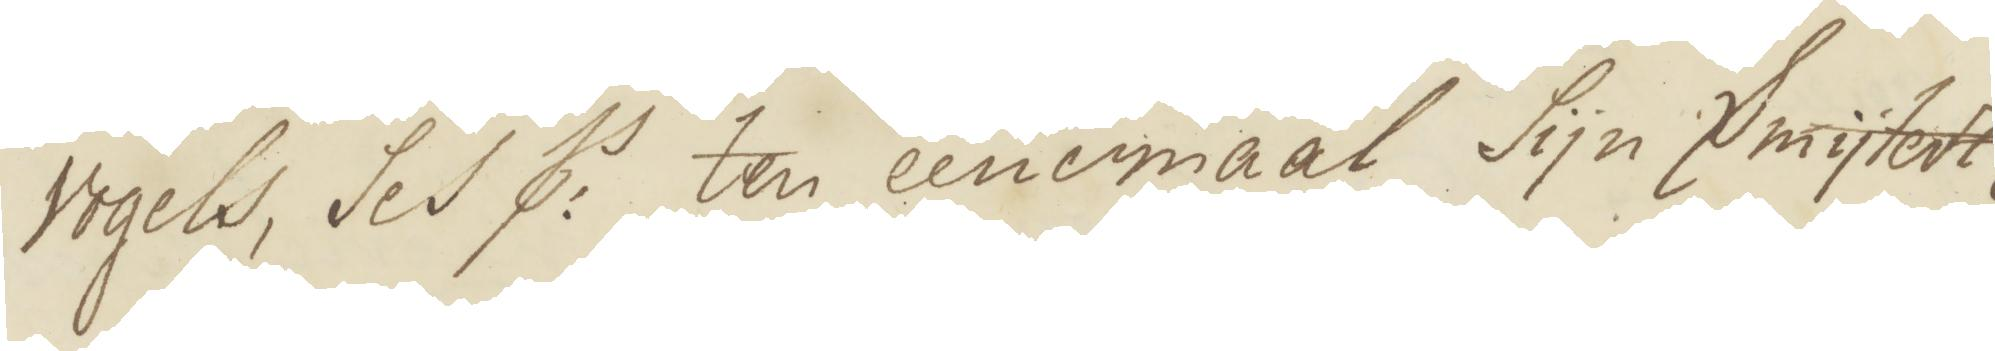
Vogels, ses p:s ten eenemaal sijn vermijtert
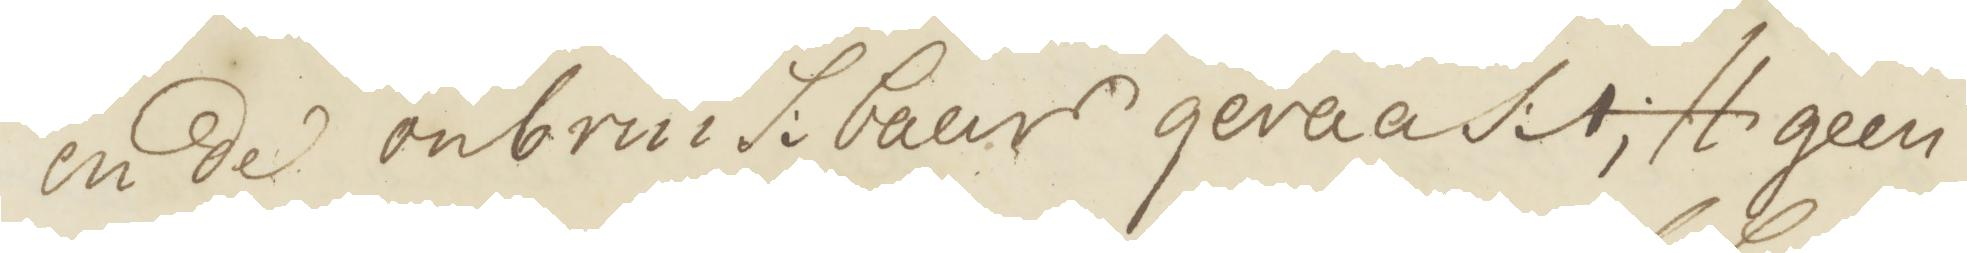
en de onbruikbaar geraakt; 't geen
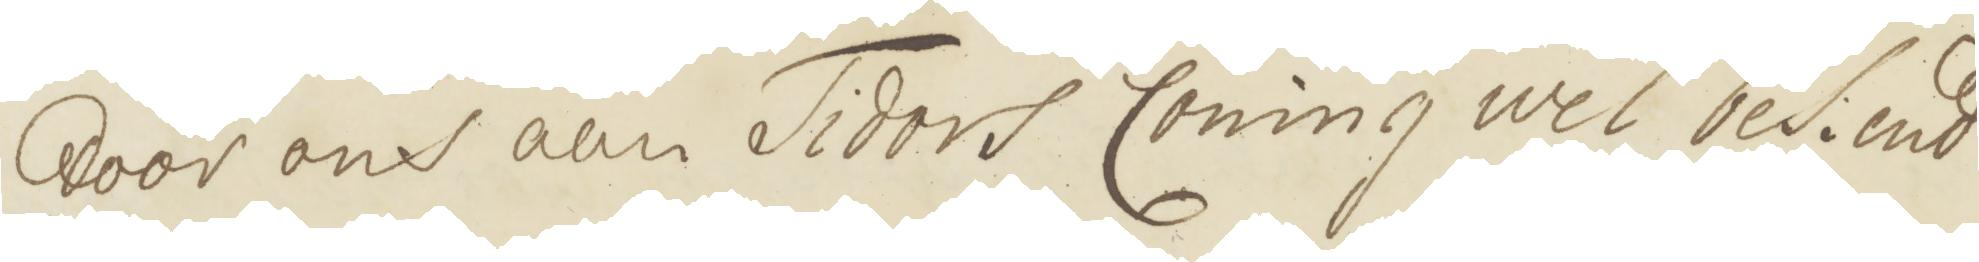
door ons aan Tidors Coning wel bekend
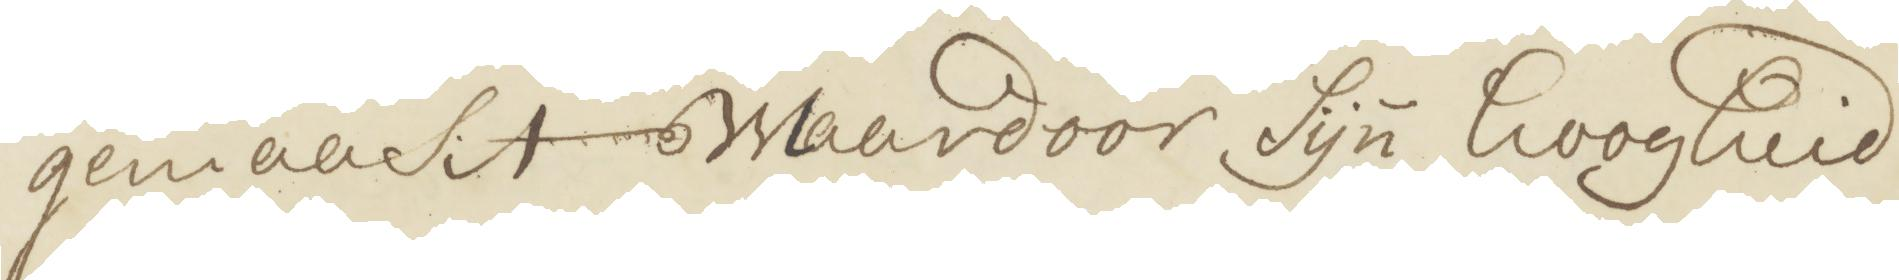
gemaakt waardoor sijn hoogheid
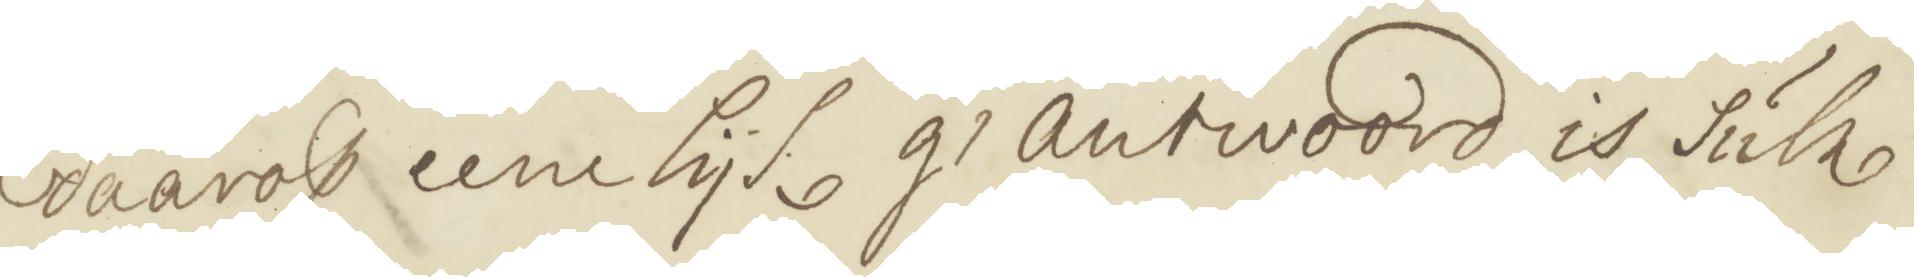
daarop eenelijk g’antwoord is, sulx
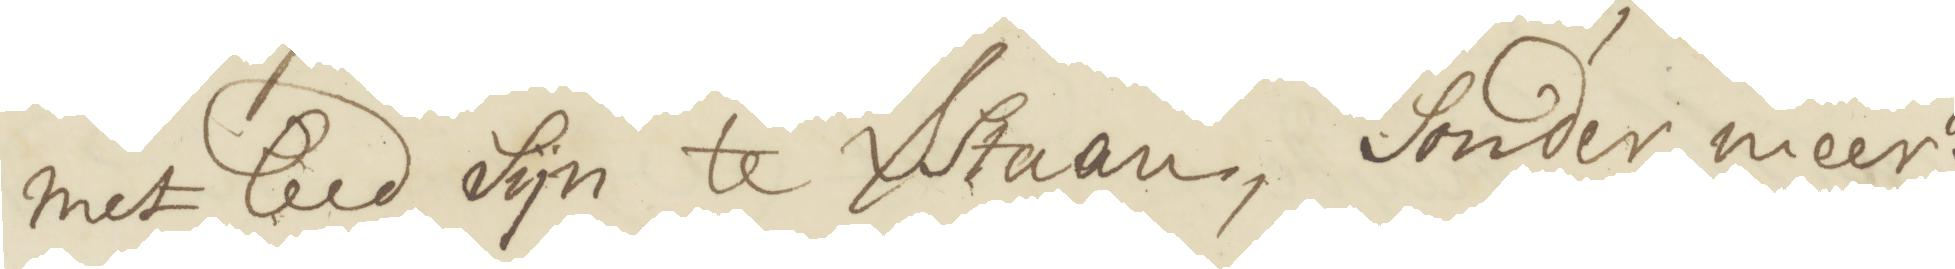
met leed sijn te verstaan, sonder meer
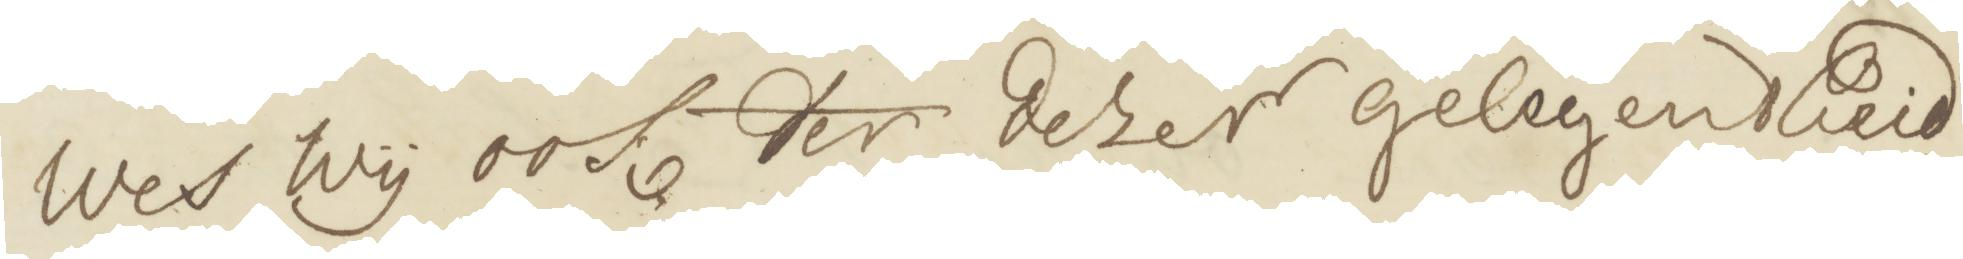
wes wij ook ter dezer gelegendheid
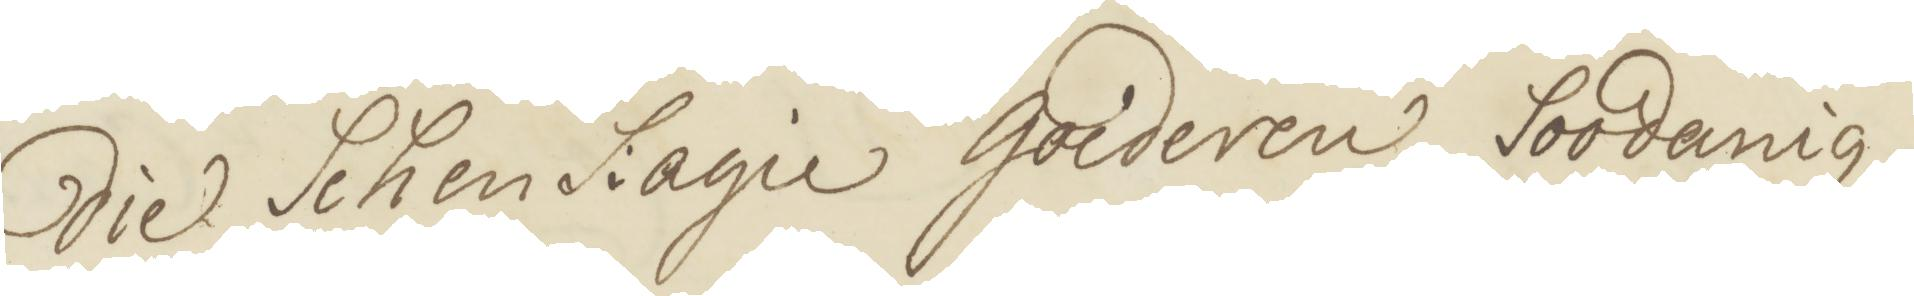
die schenkagie goederen, soodanig,
